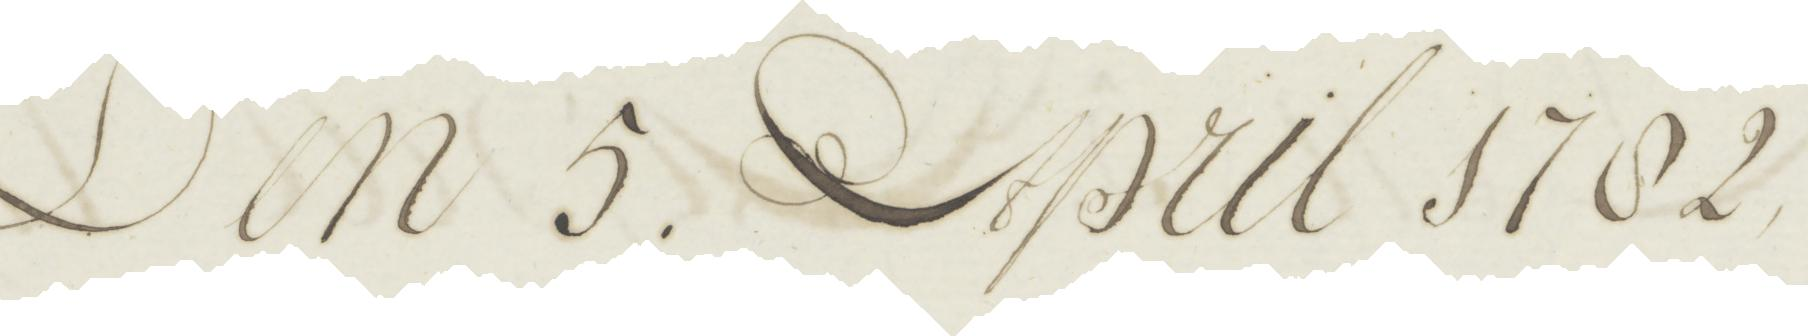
Den 5. April 1782,
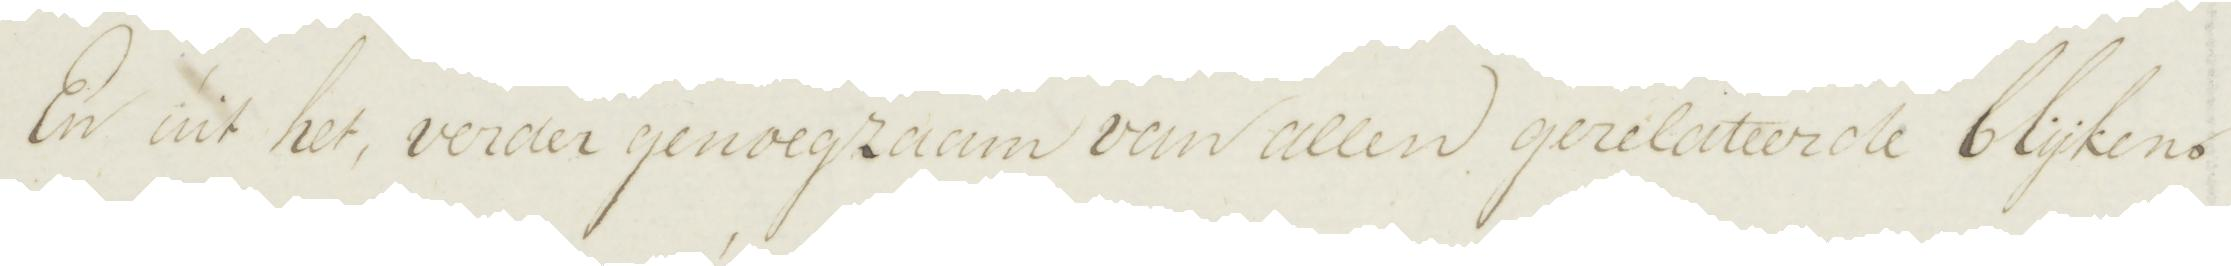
En uit het, verder genoegzaam van allen gerelateerde blijkens
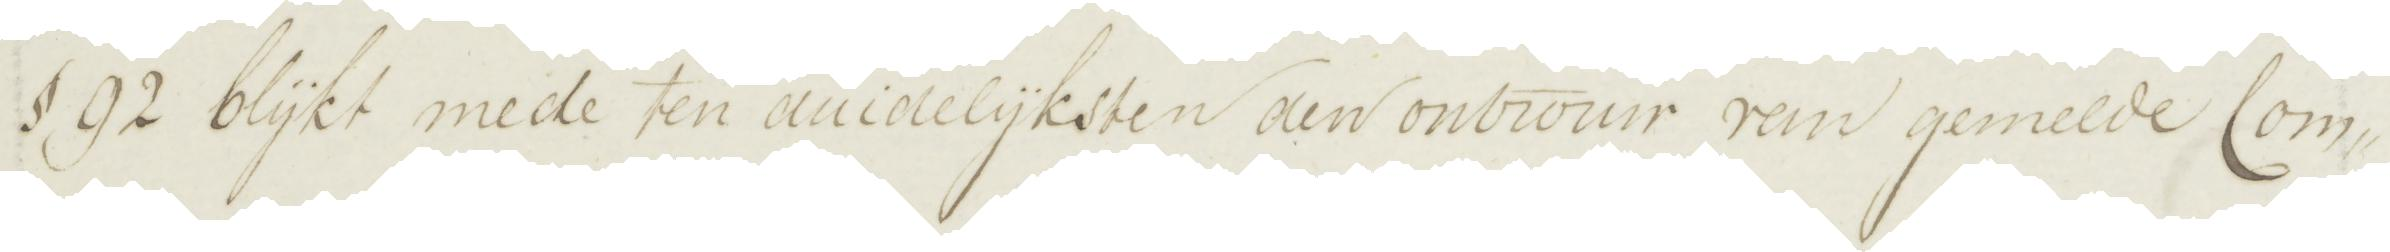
§ 92 blijkt mede ten duidelijksten den ontrouw van gemelde Com„
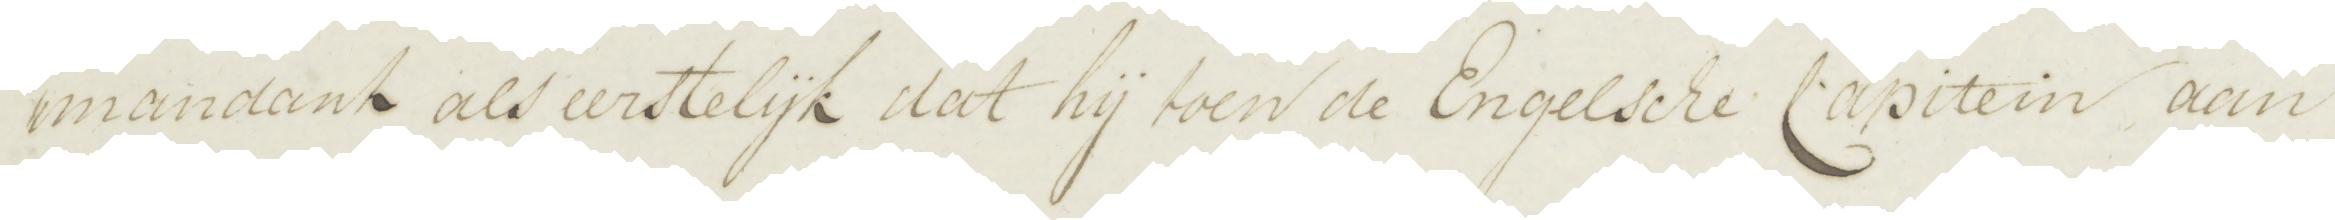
„mandant als eerstelijk dat hij toen de Engelsche Capitein aan
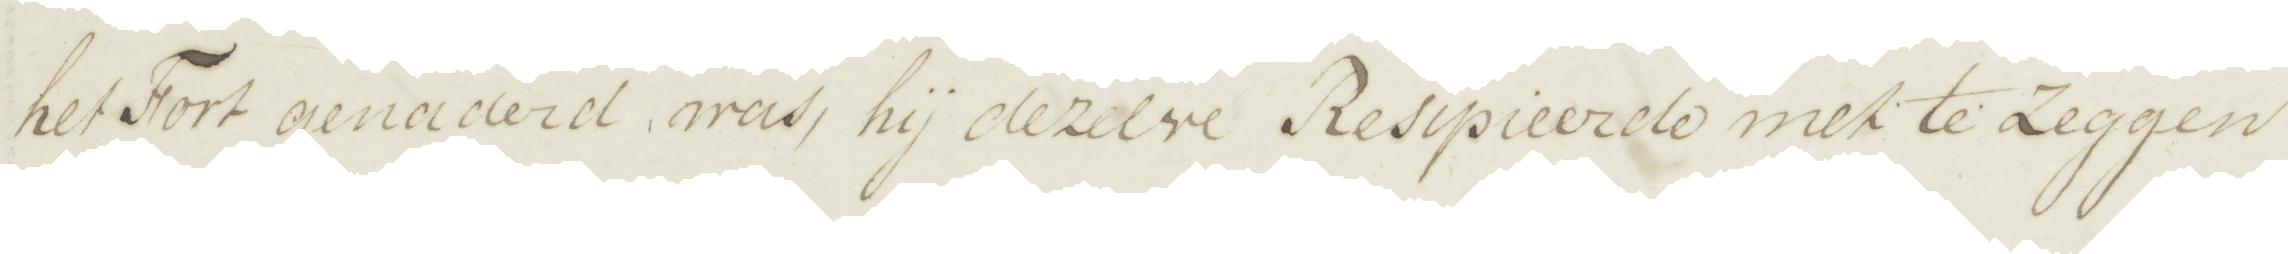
het Fort genaderd, was, hij dezelve Resipieerde met te zeggen
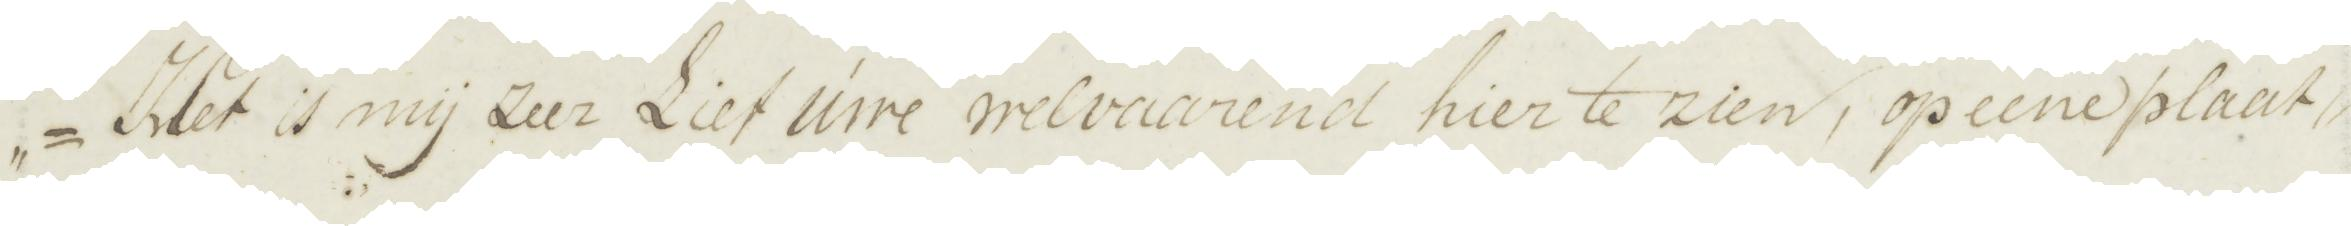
„= Het is mij zeer lief uwe welvaarend hier te zien, op eene plaat„
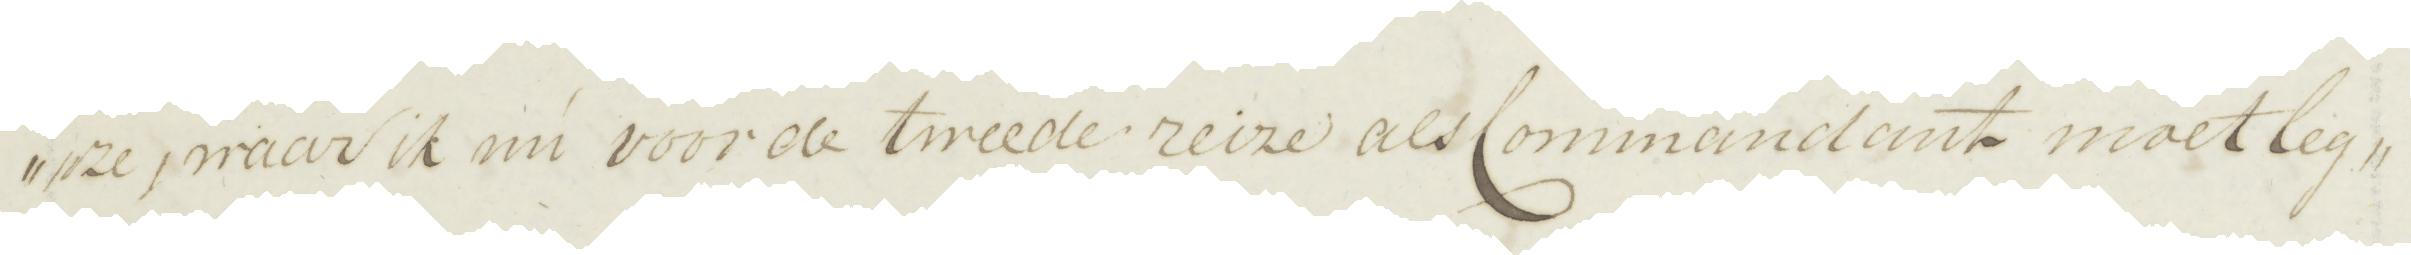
„„ze, waar ik nu voor de tweede reize als Commandant moet leg„
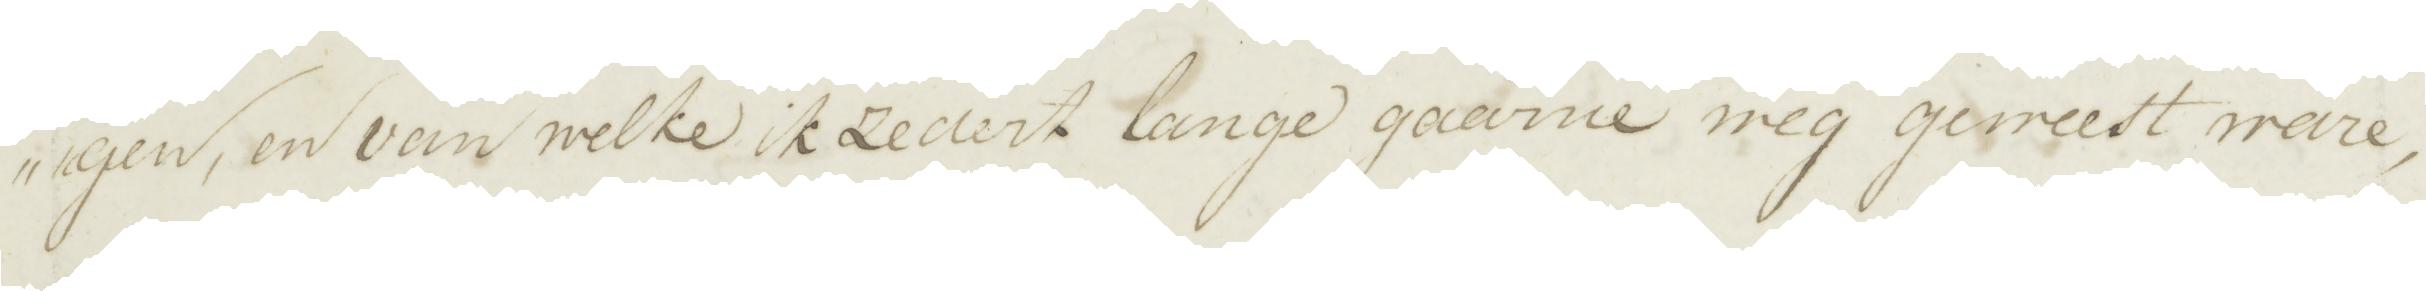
„„gen, en van welke ik zedert lange gaarne weg geweest ware,
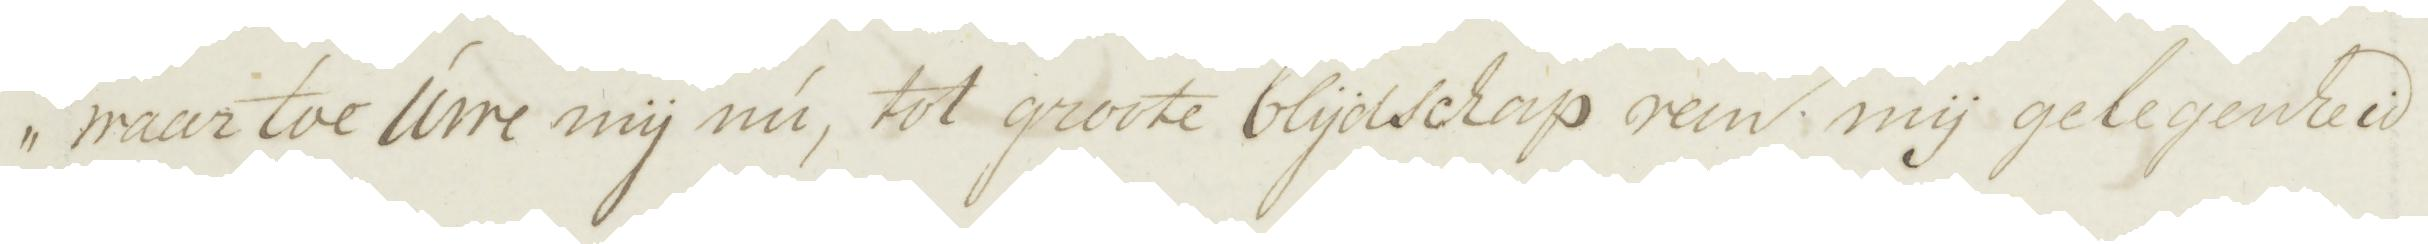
„waartoe uwe mij nu, tot groote blijdschap van mij gelegenheid
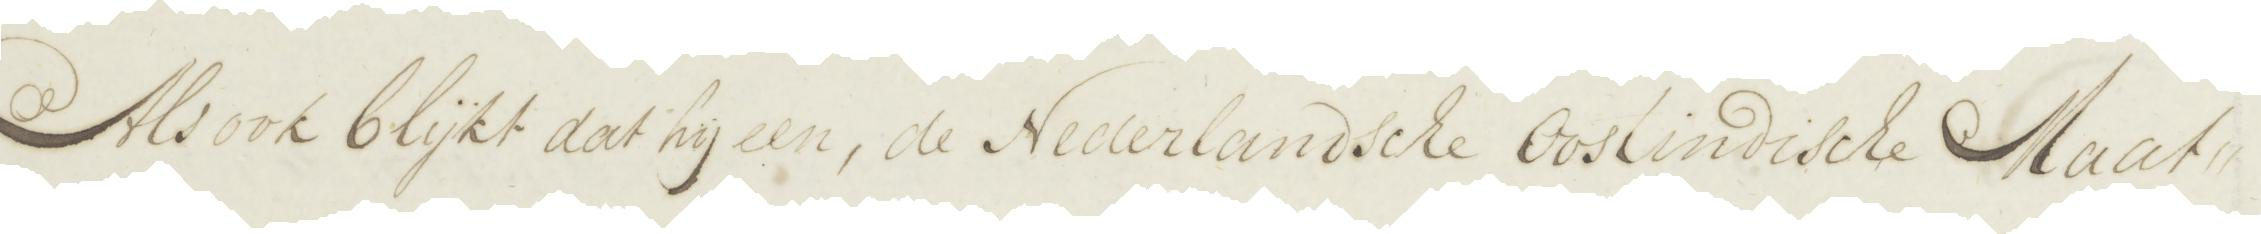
Alsook blijkt dat hij een, de Nederlandsche Oostindische Maat„
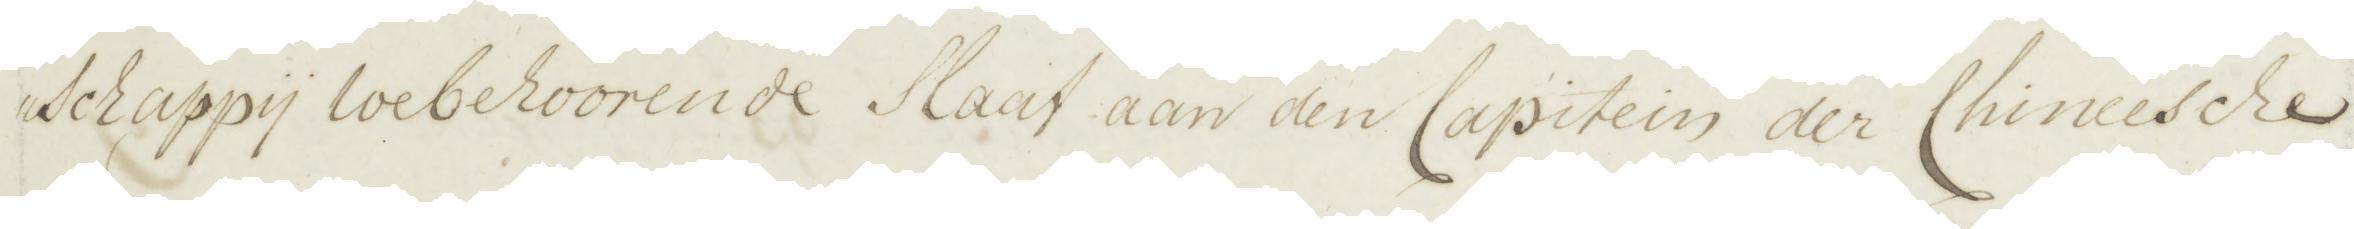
„schappij toebehoorende slaaf aan den Capitein der Chineesche
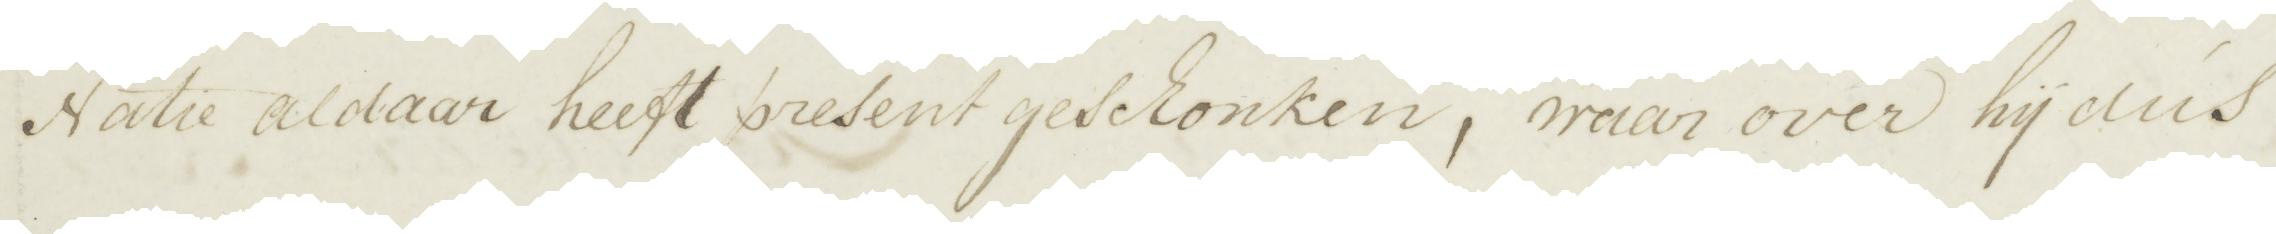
Natie aldaar heeft present geschonken, waar over hij dus
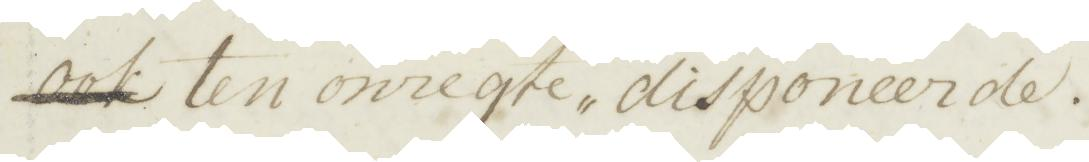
ook ten onreg'te „ disponeerde
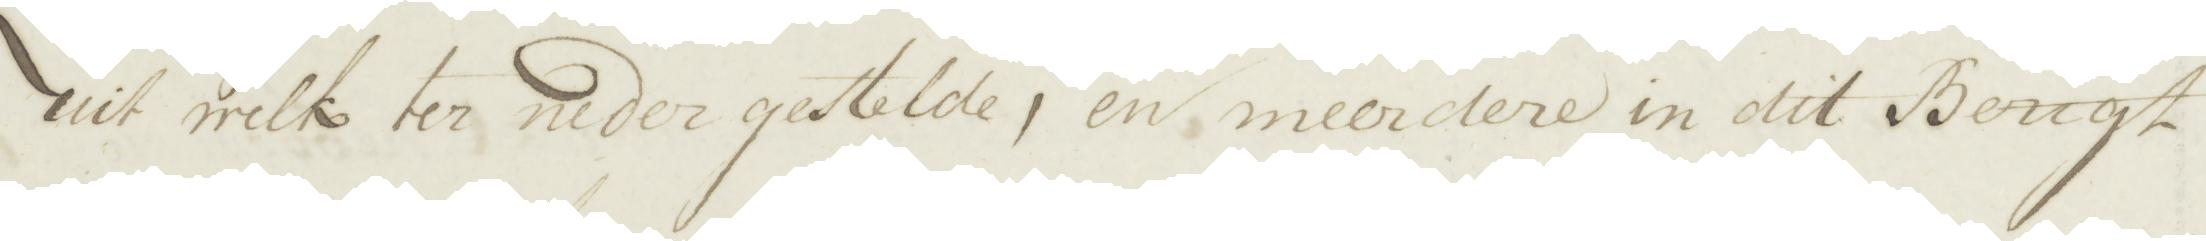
uit welk ter neder gestelde, en meerdere in dit Berigt
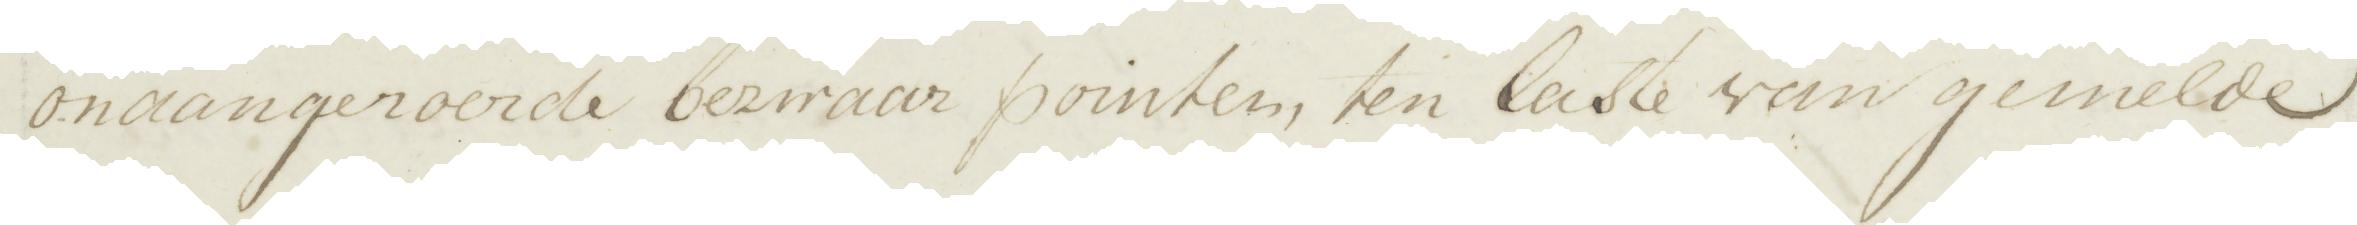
onaangeroerde bezwaar pointen ten laste van gemelde
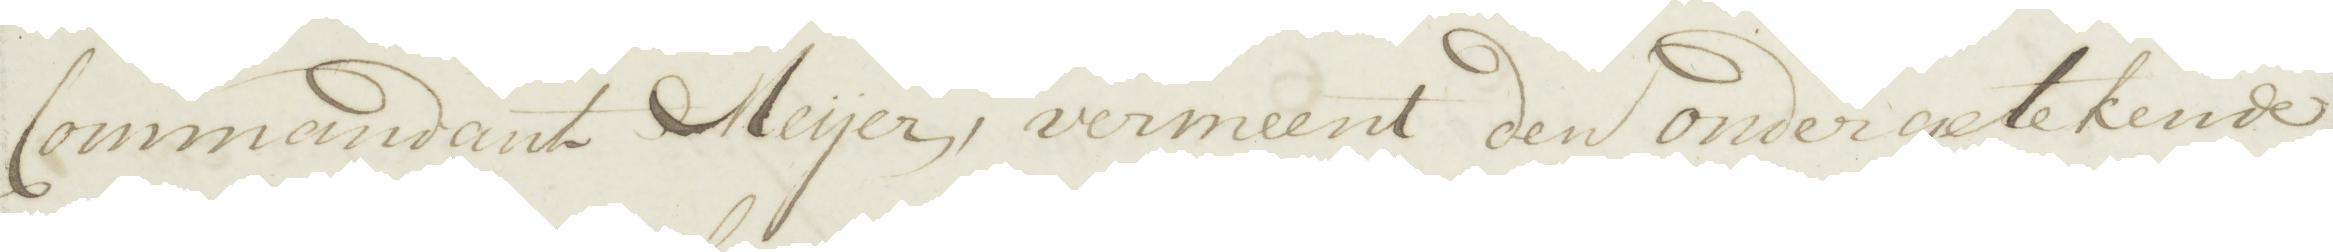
Commandant Meijer, vermeent den onder getekende
